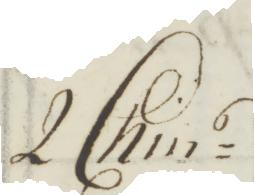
2 Chin=s
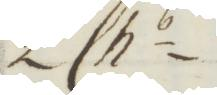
2 Ch=s
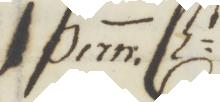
1 pan. Ch=s
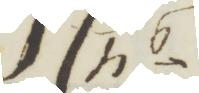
1 Ch=s
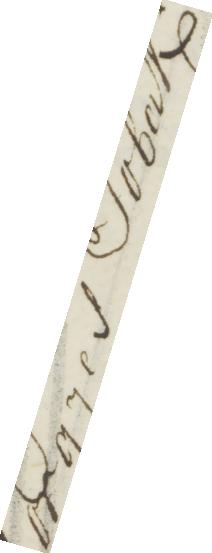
Corgjes Tobak
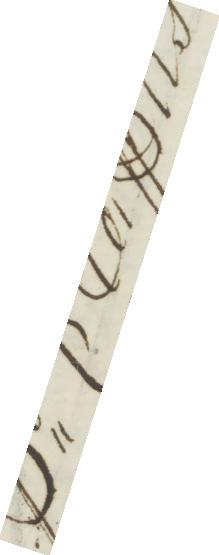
P„s Clappus
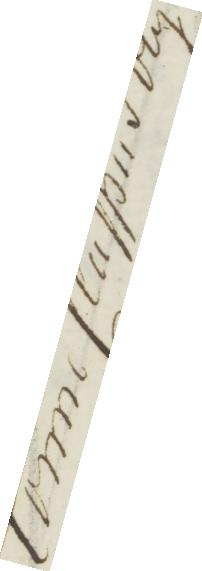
tonne Clappus oly
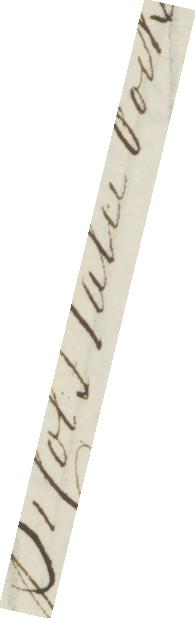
Picols talu doek
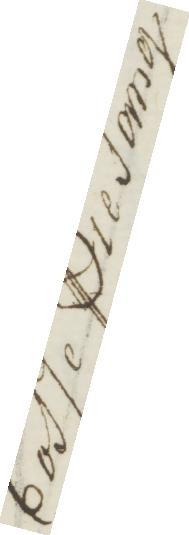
bosse Piesang
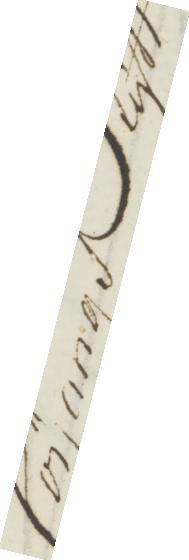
Coijangs Rijst
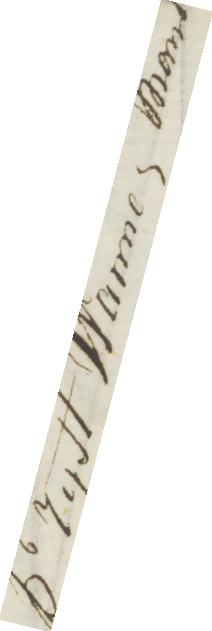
ps ryst Wanne en mande
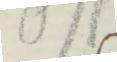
871
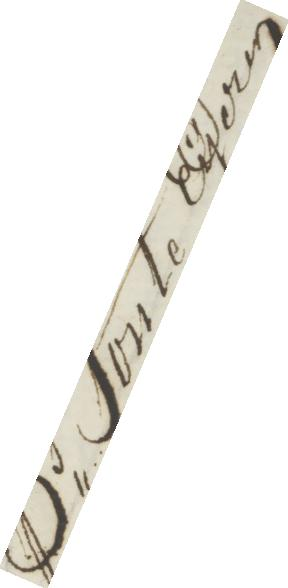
p„s Soute Eijeren
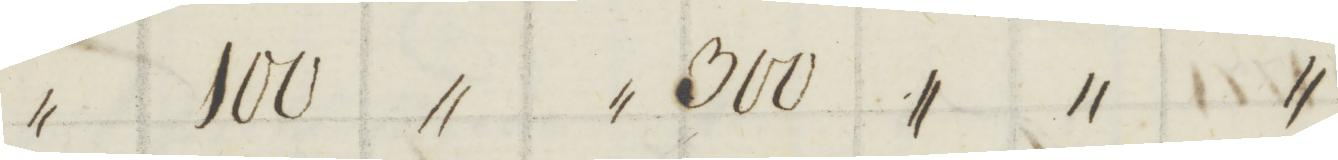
„ 100 „ „ 300 „ „ „
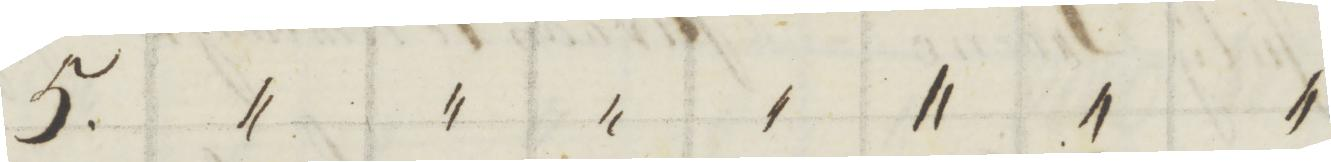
5. „ „ „ „ „ „ „
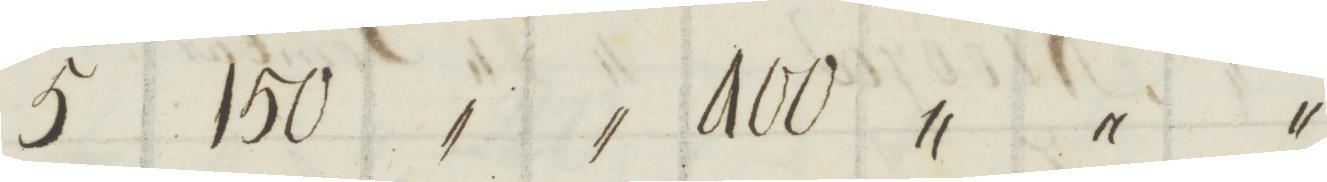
5 150 „ „ 400 „ „ „
